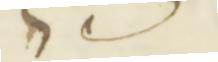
53,
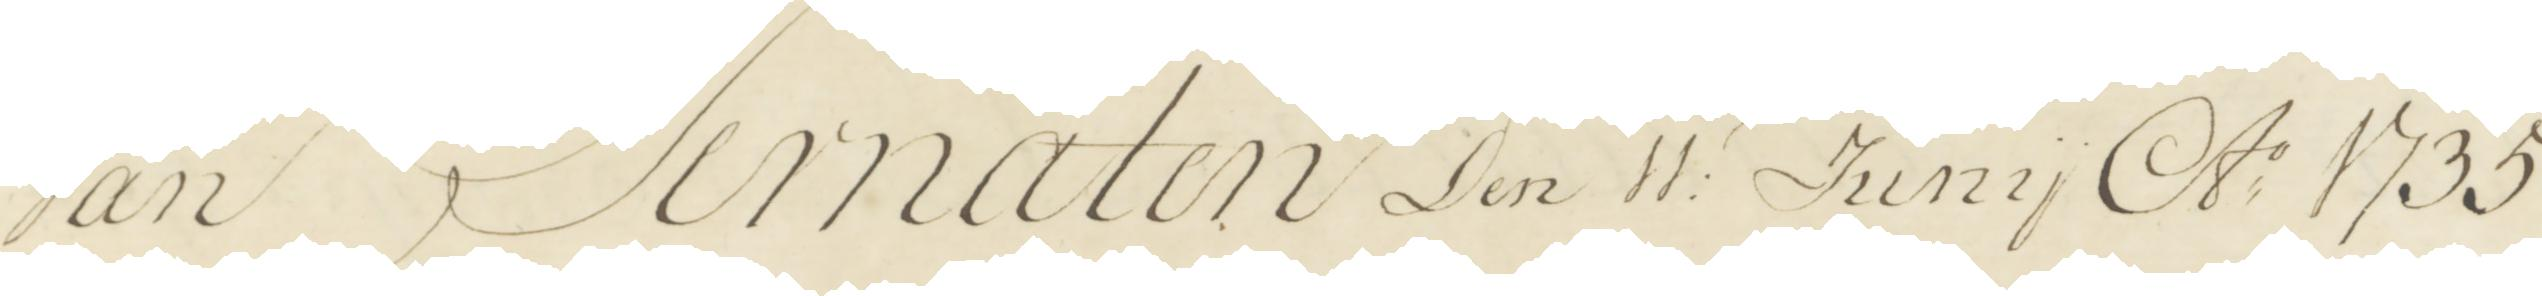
Van Ternaten Den 11:' Iunij A„o 1735
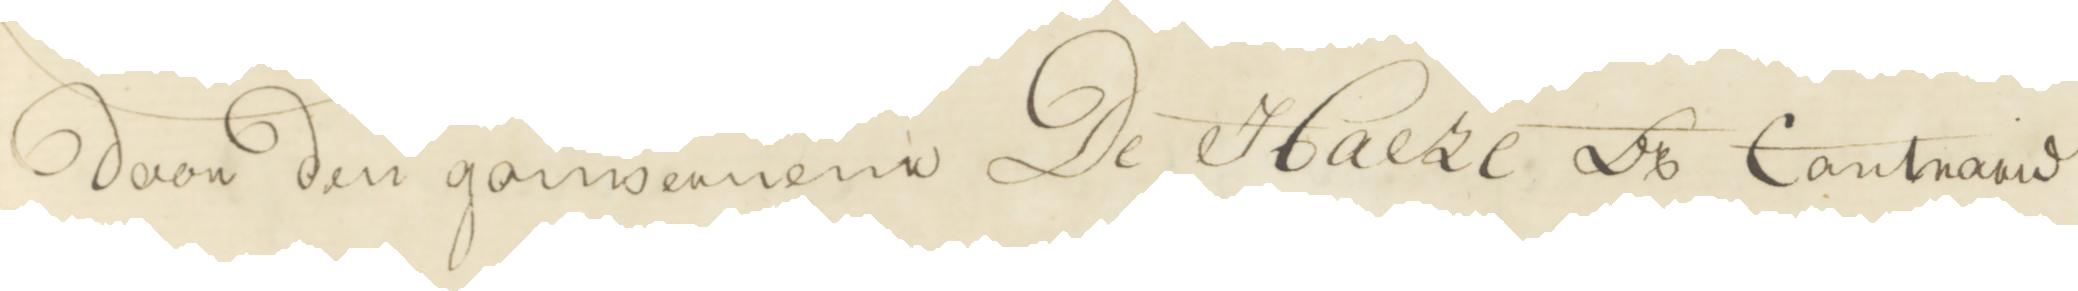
door den gouverneur De Haeze ter Contrarie
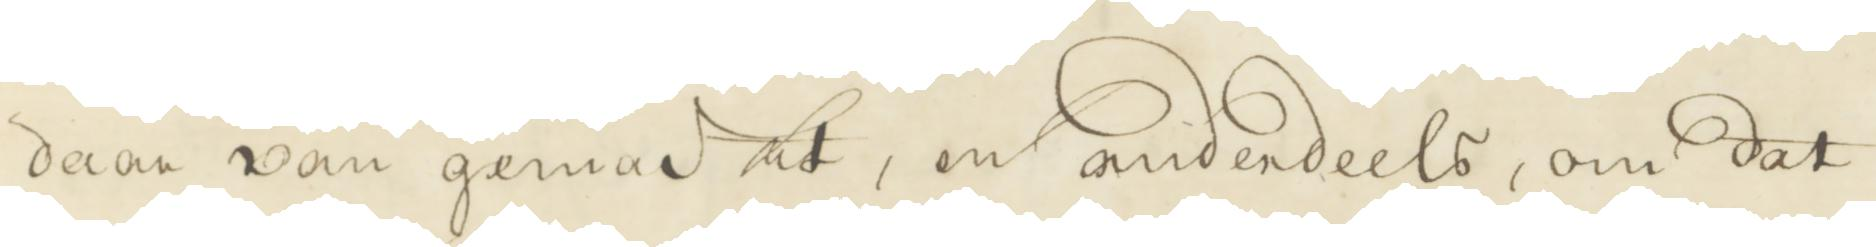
daar van gemaekt, en anderdeels, om dat
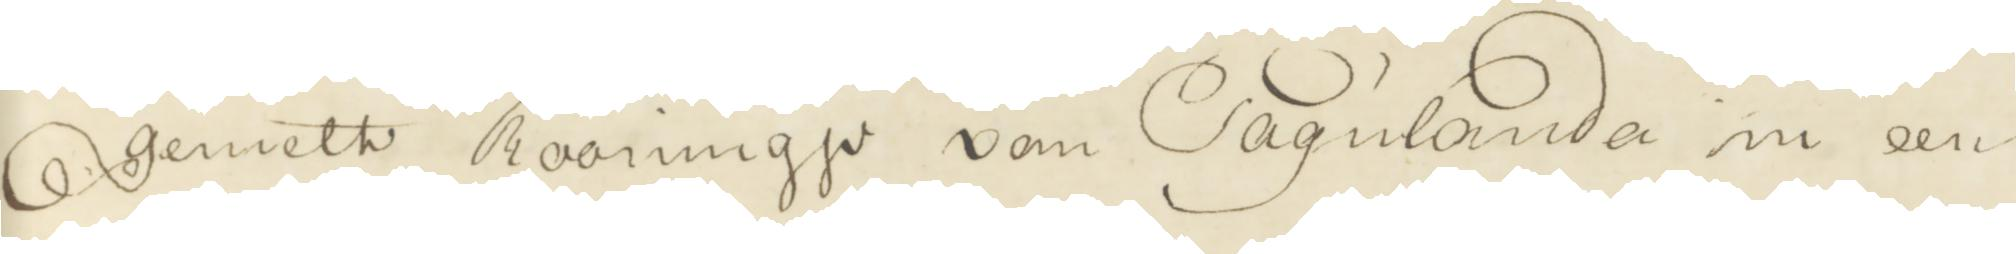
gemelt kooningje van Pagulanda in een
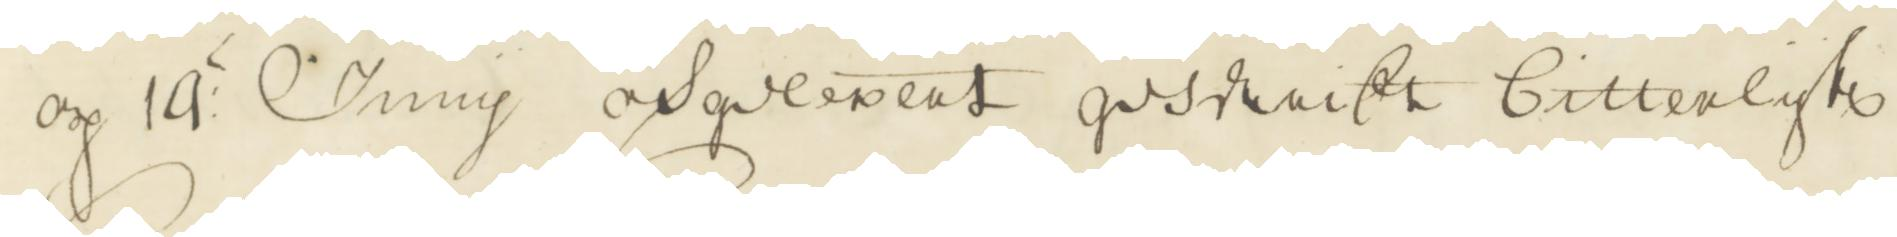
op 14:' Iunij overgelevert geschrift bitterlijk
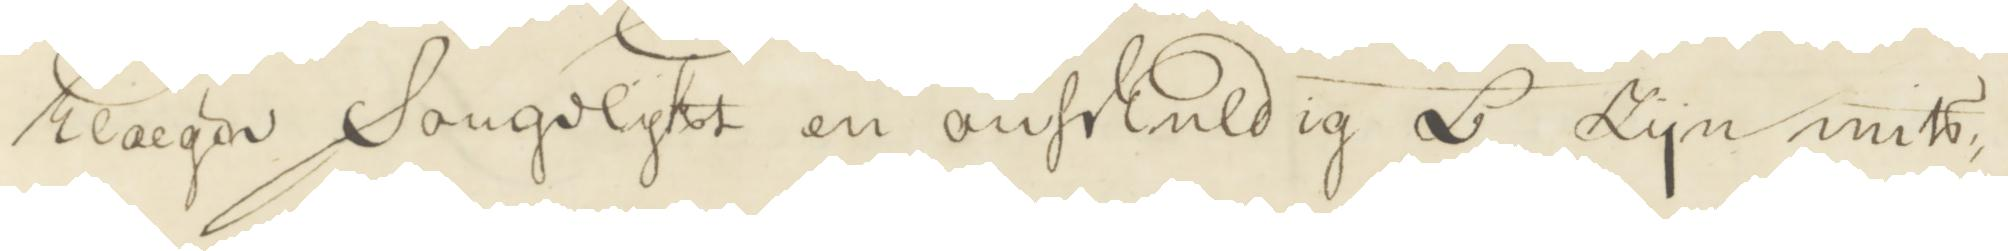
klaegde verongelijkt en onschuldig te zijn mits„
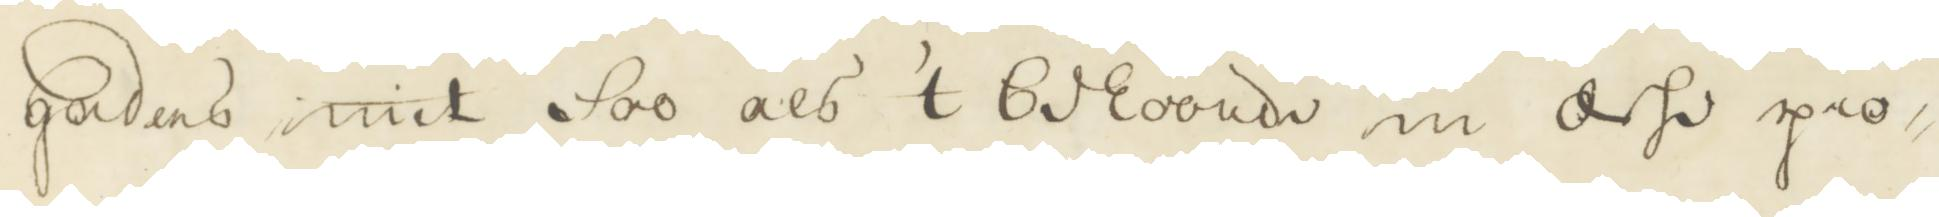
gaders niet soo als ’t behoorde in dese pro„
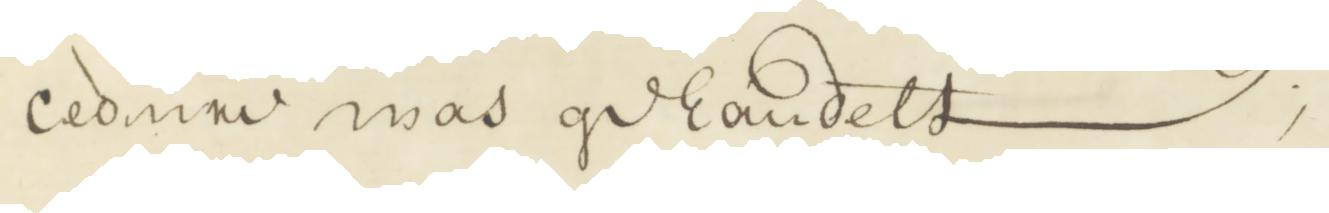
cedure was gehandelt
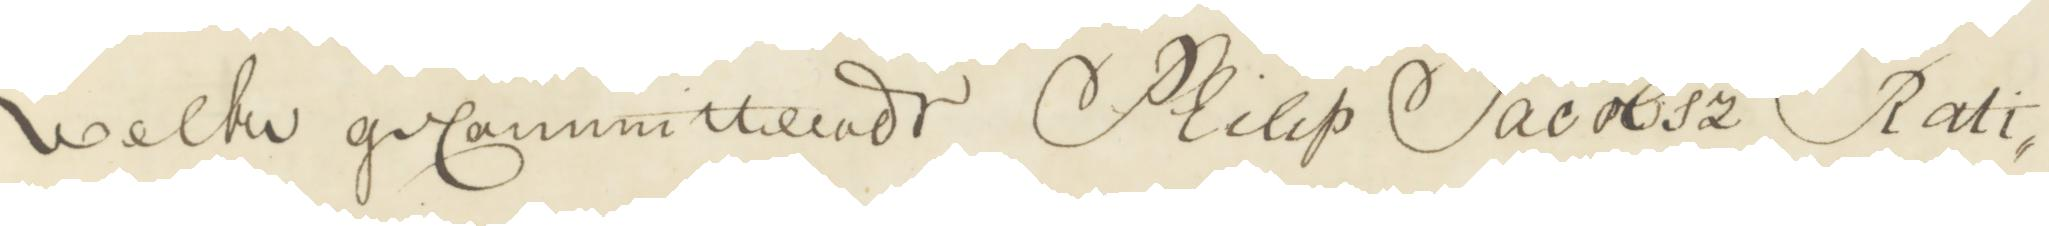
welke gecommitteerd Philip Jacobsz Rati„
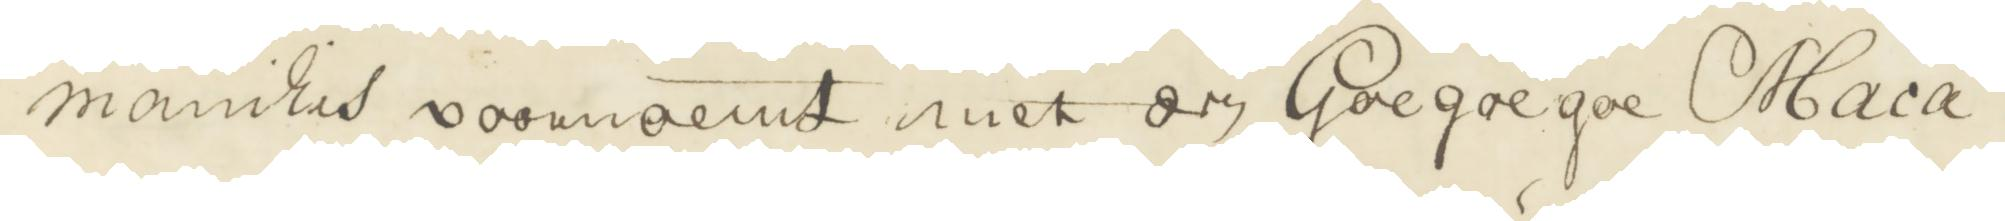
manchis voornoemt met den Goegoegoe Maca
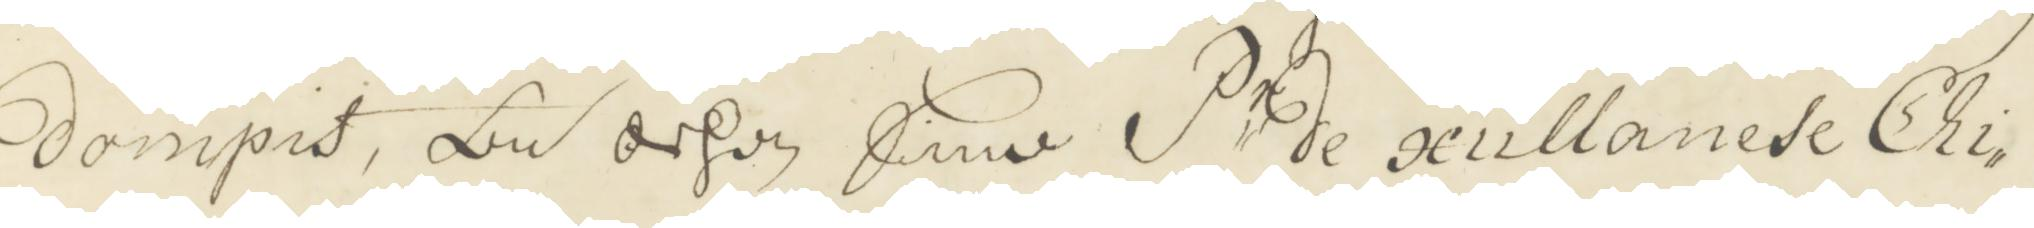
dompis, ter desen fine P„r de xullanese Chi„
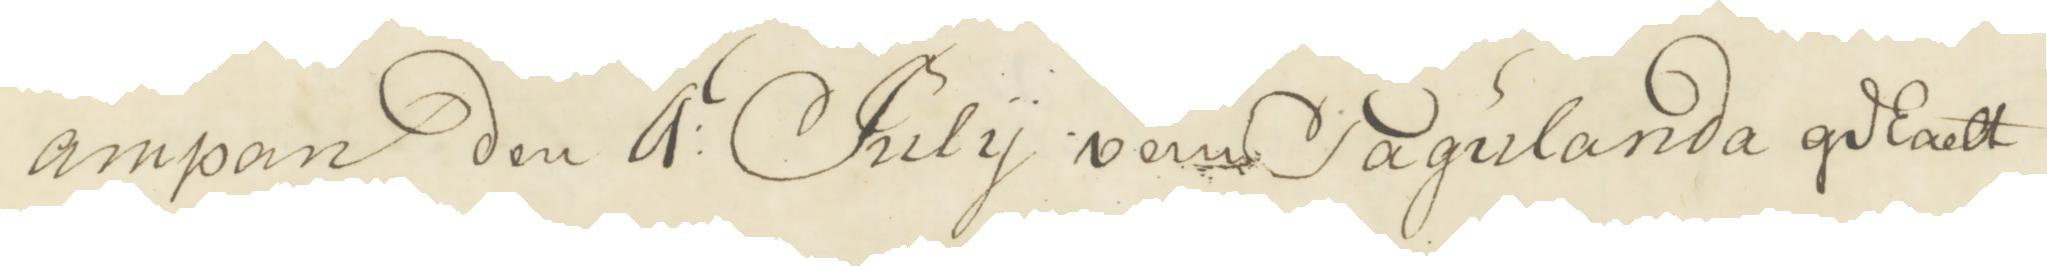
ampan den 4:' Iulij: van Pagulanda gehaelt
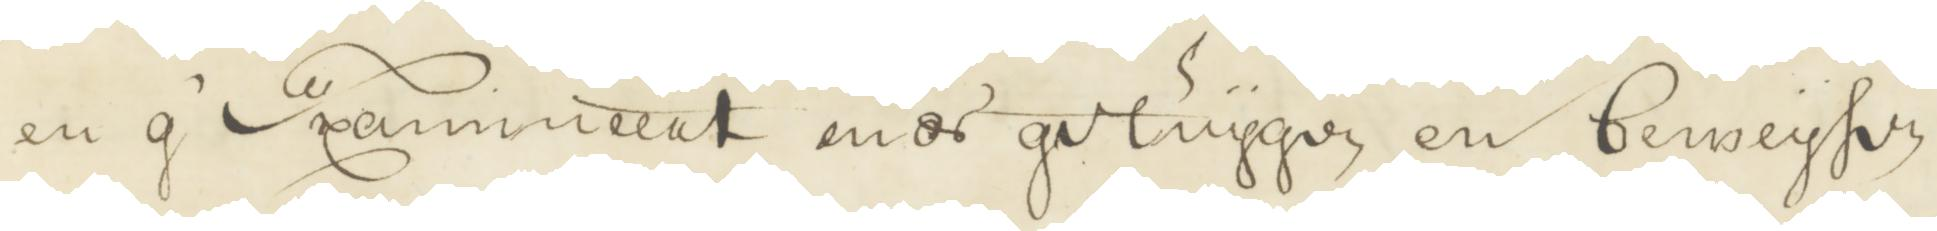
en g’Examineert en de getuijgen en beweijsen
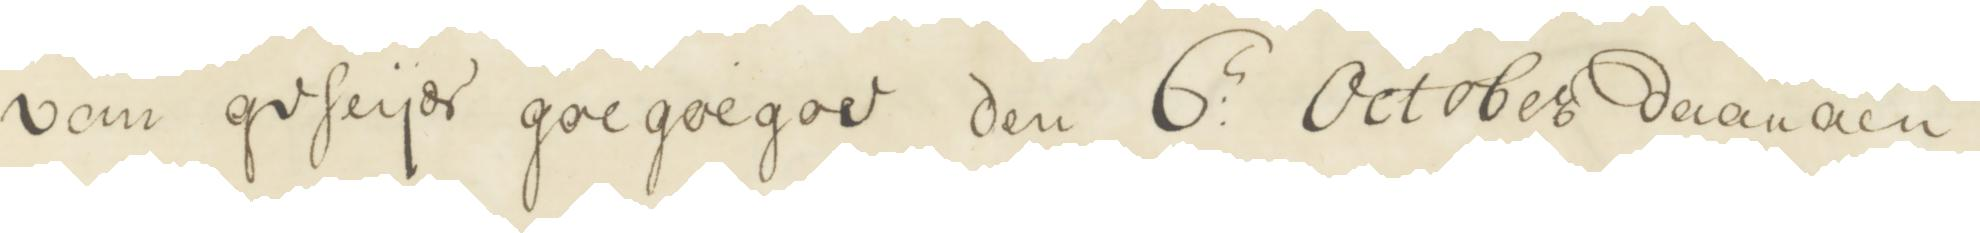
van geseijde goegoegoe den 6:' October daar aen
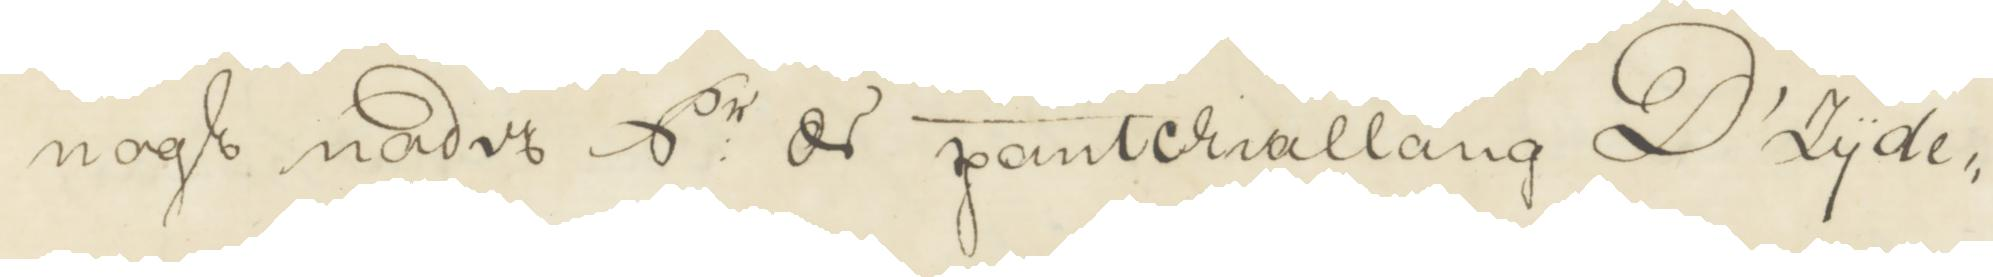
nogh nader P:r de pantchiallang D' zijde„
